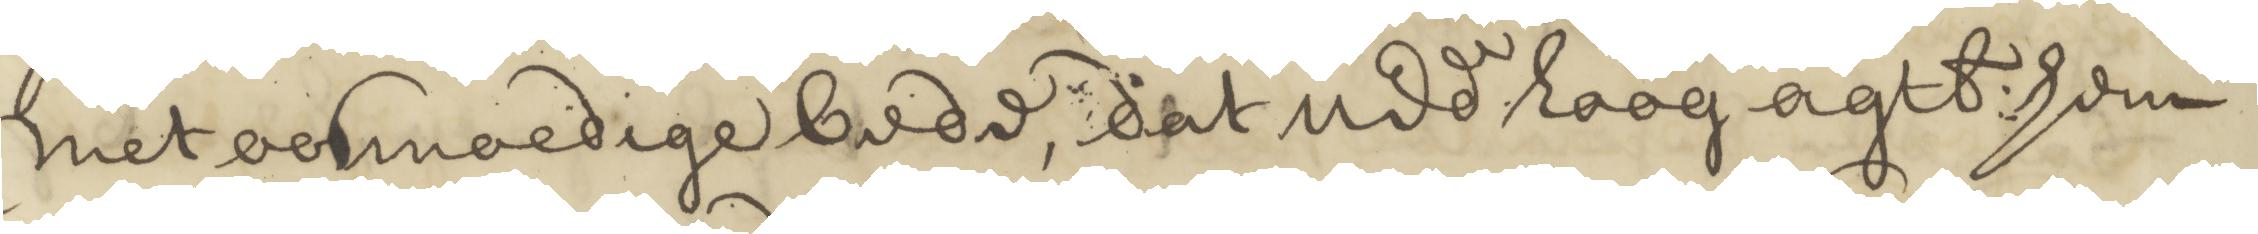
met oetmoedige bede, dat u Ed.e hoog agtb: hem
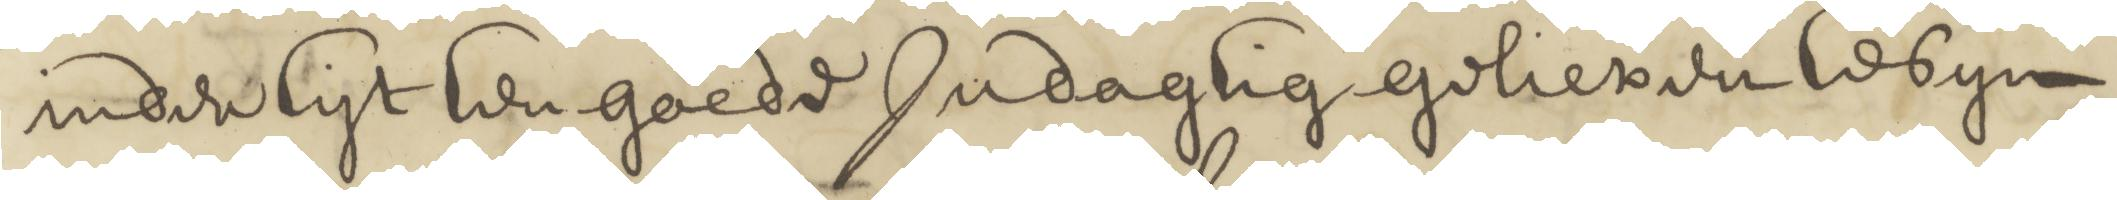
inder tijt ten goede Jndagtig gelieven te syn
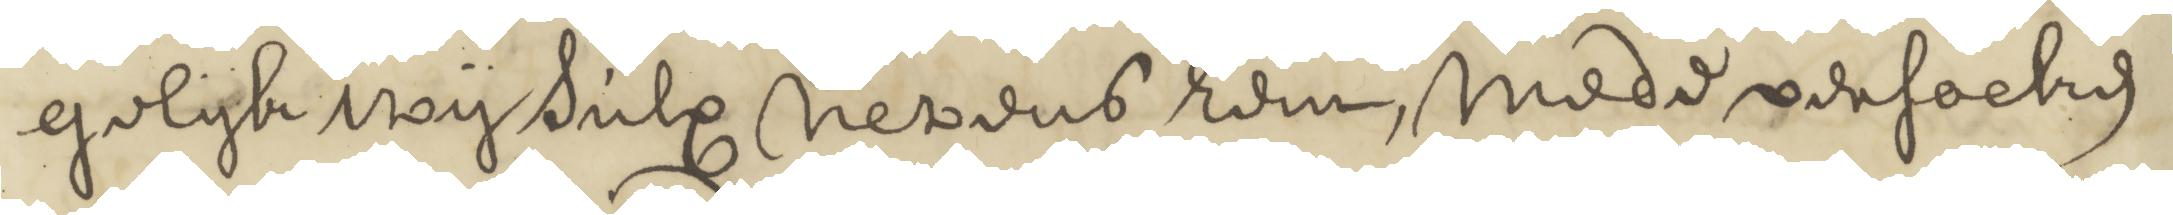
gelijk wij sulx nevens hem, mede versoeken
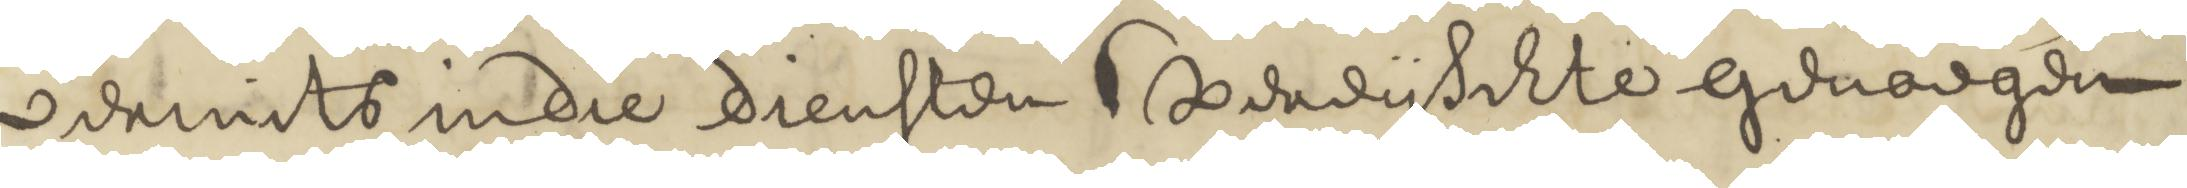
vermits in die diensten 't vereijschte genoegen
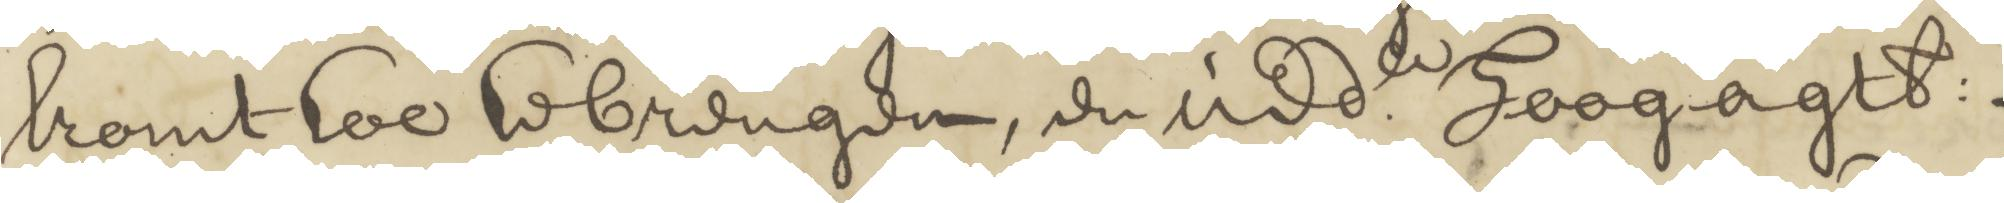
komt toe te brengen, en u Ed:le Hoog agtb:
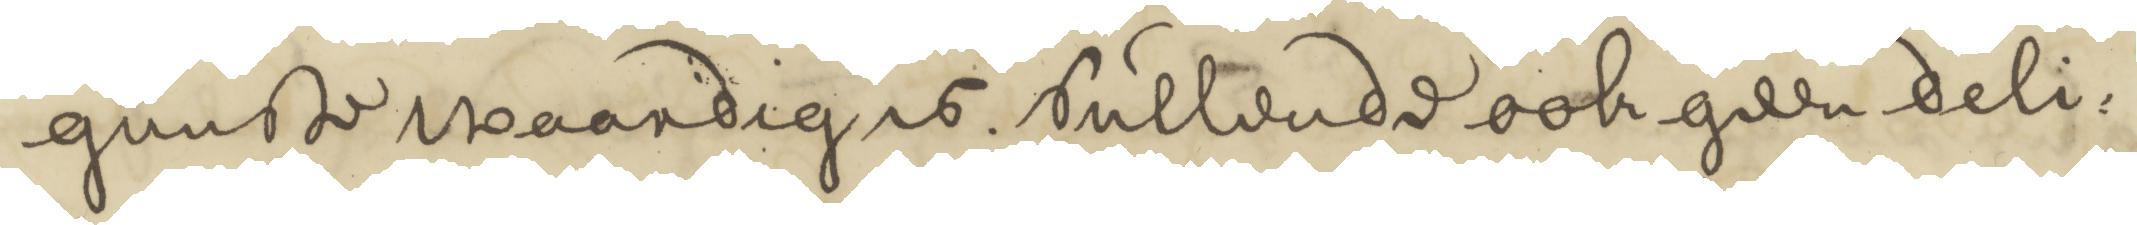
gunste waardig is. sullende ook geen deli„
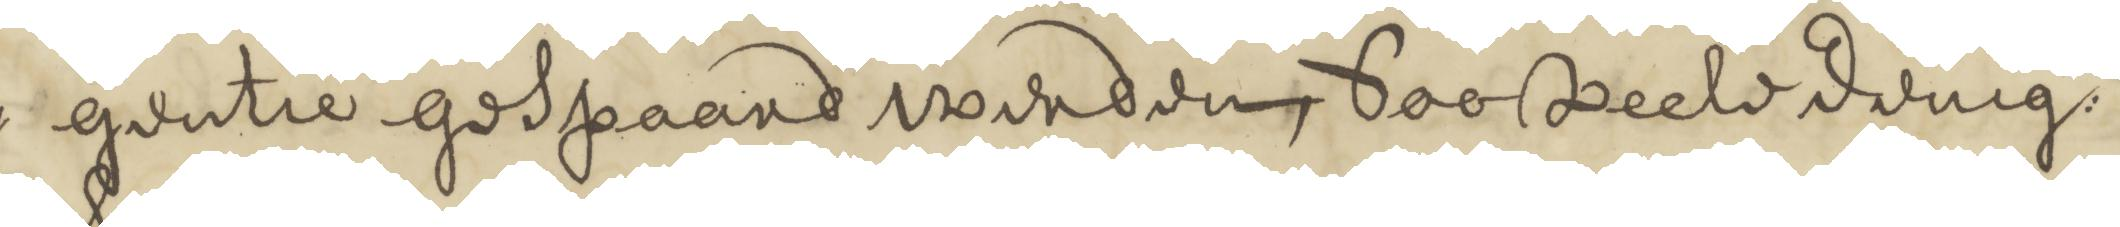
gentie gespaard werden, soo veele Eenig:
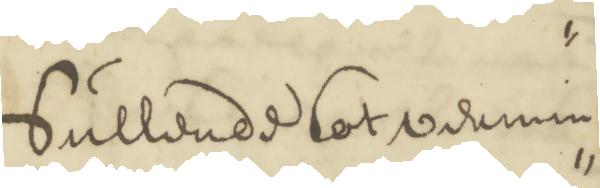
sullende tot vermin
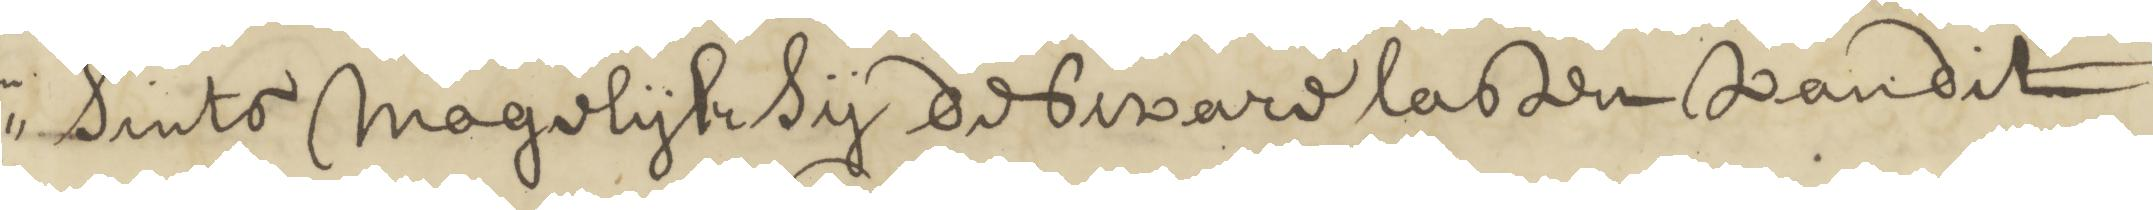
„sints mogelijk sij de sware lasten van dit
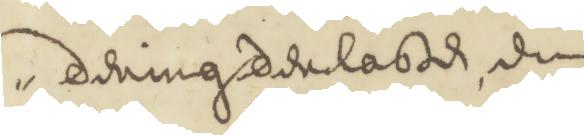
,dering der lasten, en
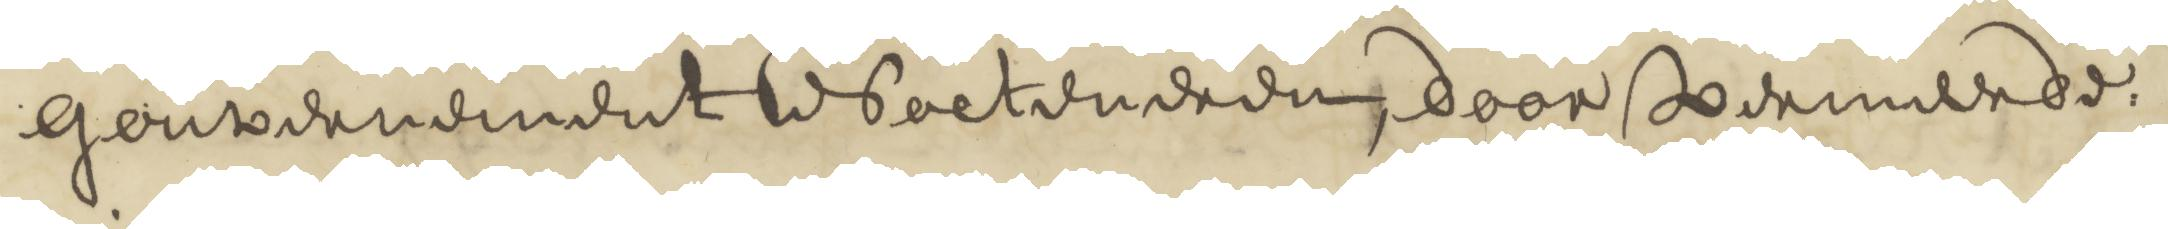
gouvernement te soeteneren, door vermeerde:
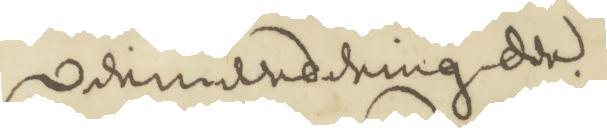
vermeerdering der
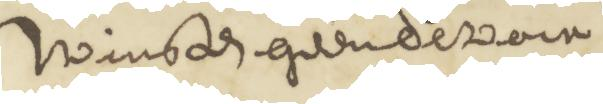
winsten geen devoir
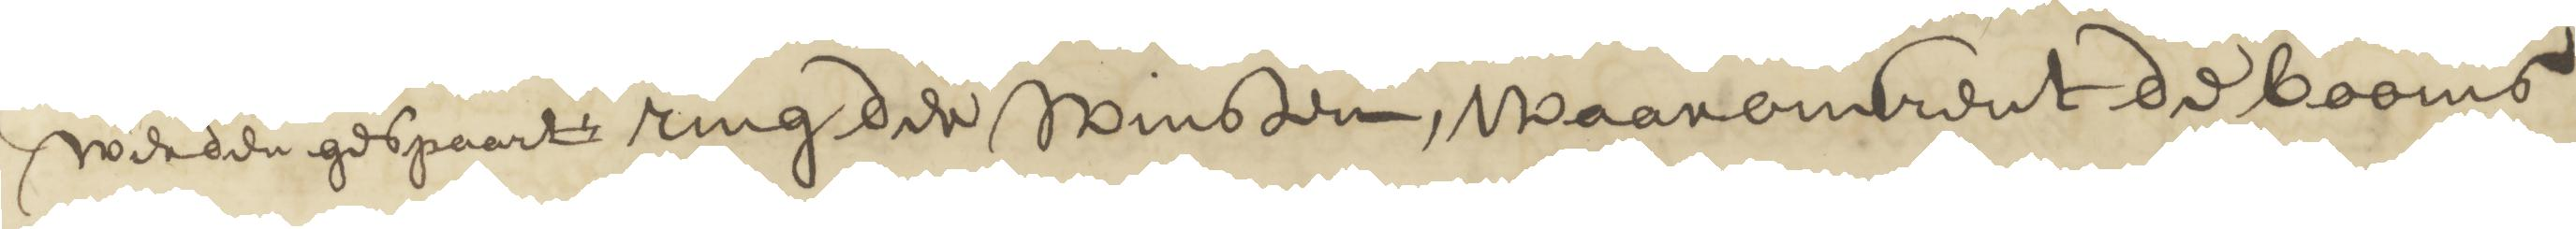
werden gespaart „ring der winsten, waaromtrent de booms
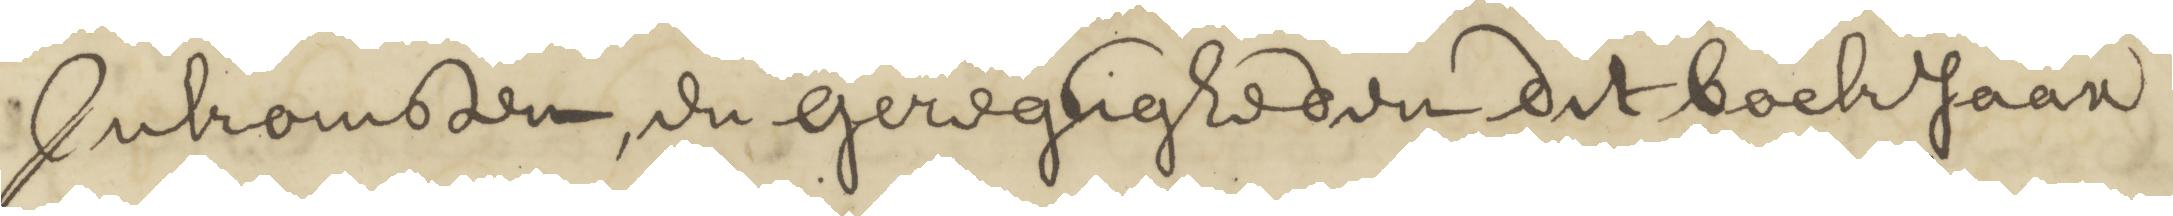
Jnkomsten, en geregtigheden dit boekjaar
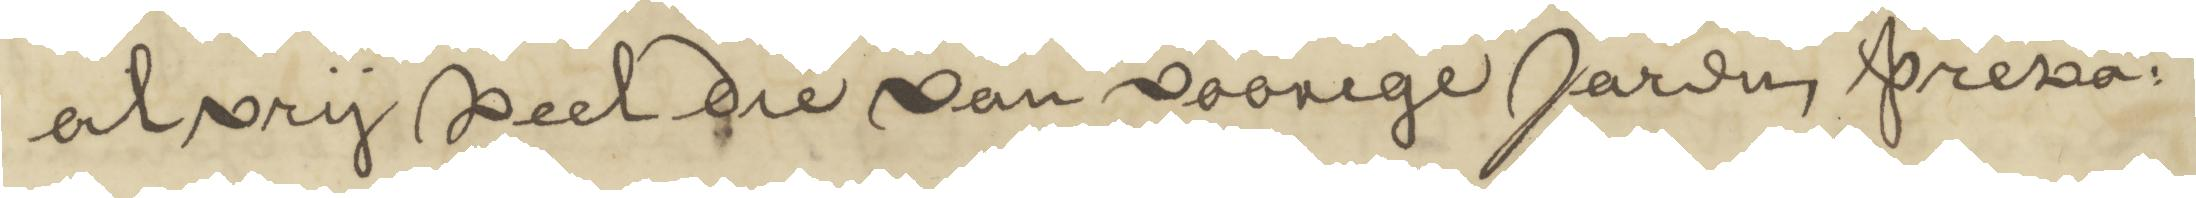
al vrij veel die van voorige Jaren, preva„
